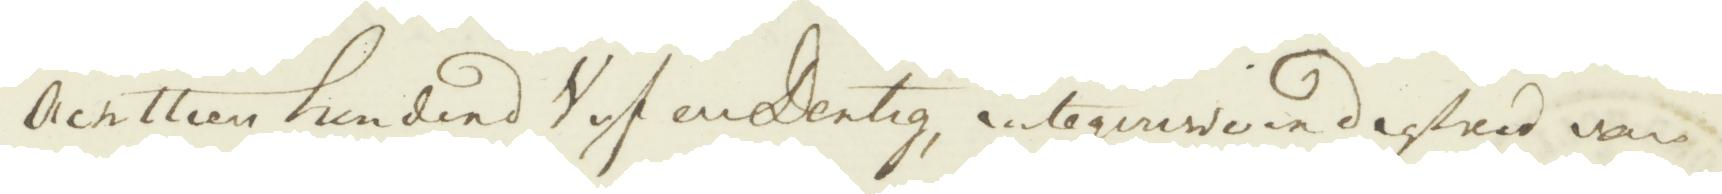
Acnttien honderd Vyf en Dertig, integenwoordigheid van
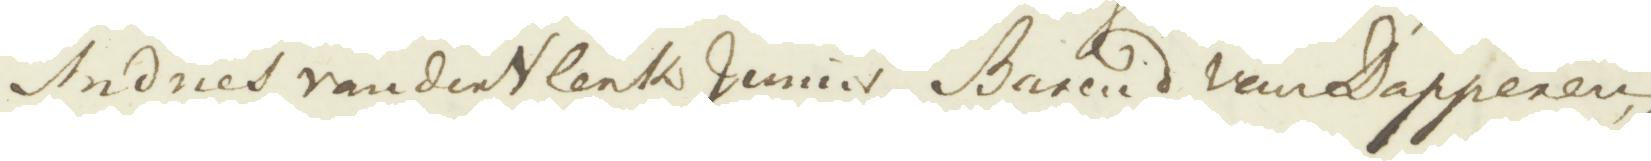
Andries vander Vlerk Junior, Barend van Dapperen,
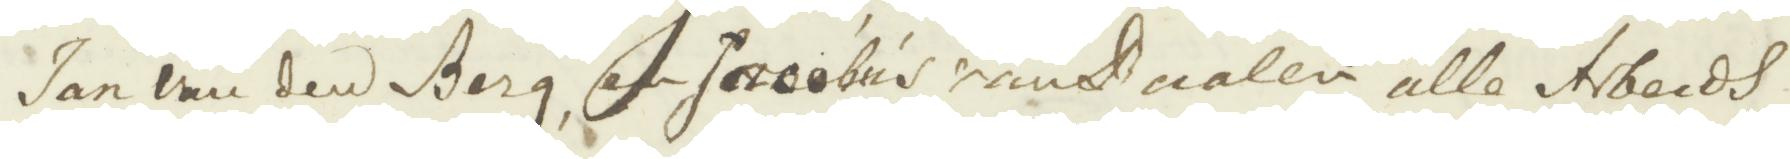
Jan van den Berg, en Jacobus van Daalen, alle Arbeids
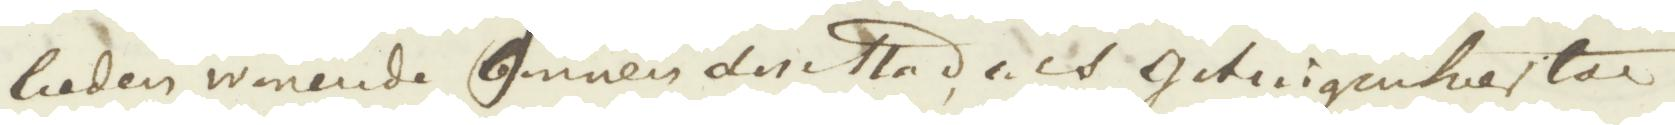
lieden, wonende binnen dese stad als getuigen hier toe
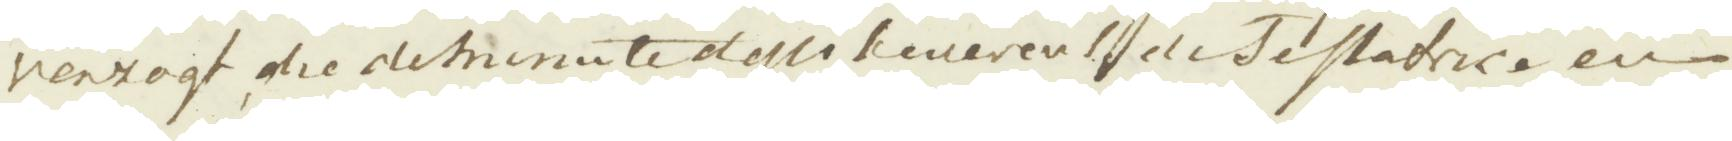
verzogt, die de minute deses, benevens de Testatrice, en
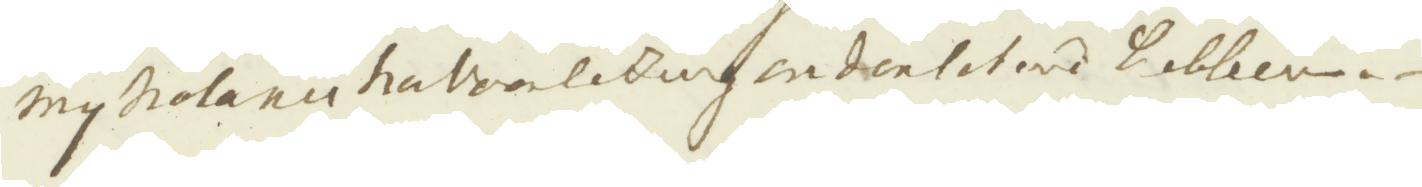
my notaris na voorlezing ondertekend hebben.
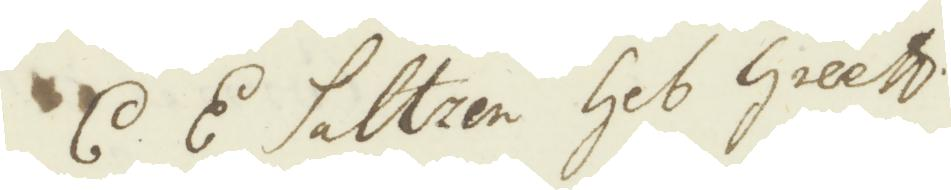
C.E Saltzen Geb Greew
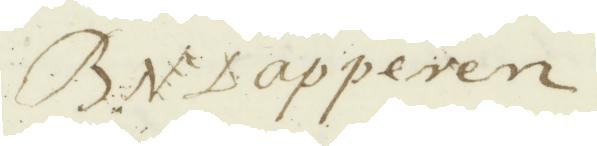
B. v Dapperen
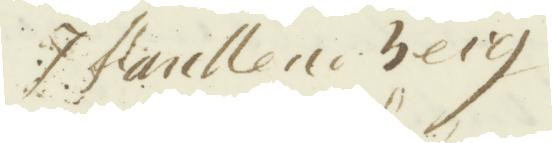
J. vanden Berg
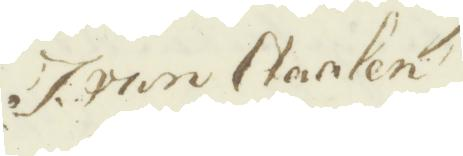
J: van Daalen
